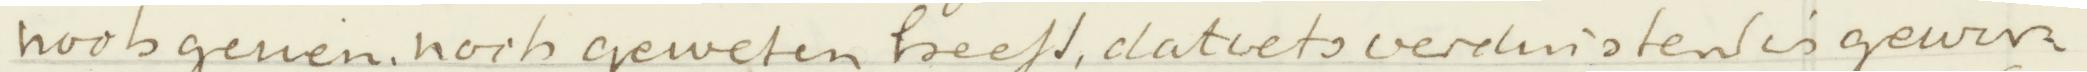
noch gezien, noch geweten heeft, dat iets verduisterd is gewor
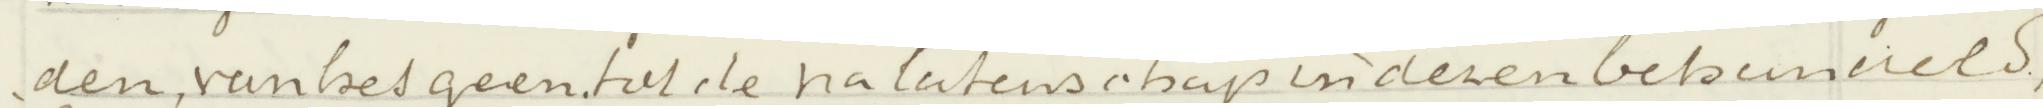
=den, van het geen tot de nalatenschap in dezen behandeld
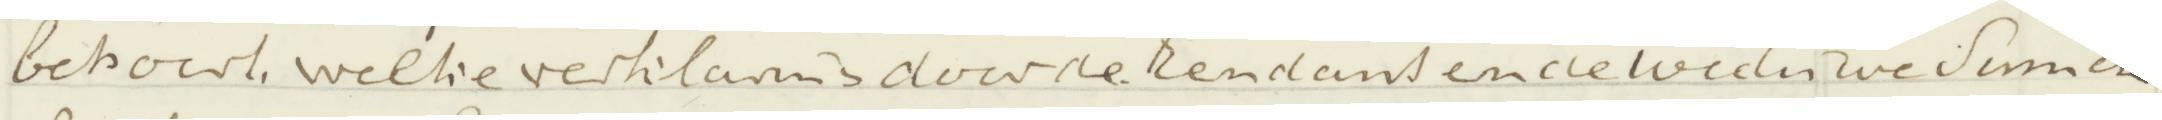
behoort, welke verklaring door de rendant en de weduwe Simon
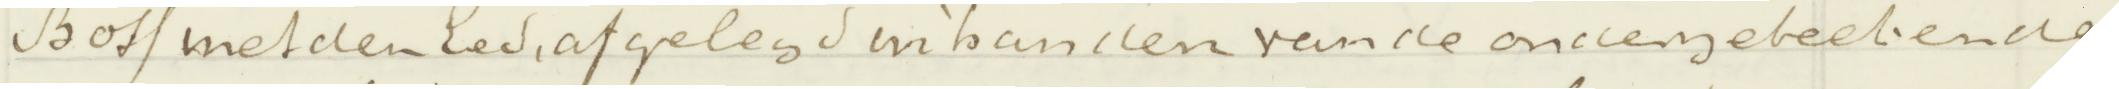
Boss met den Eed, afgelegd in handen van de ondergeteekende
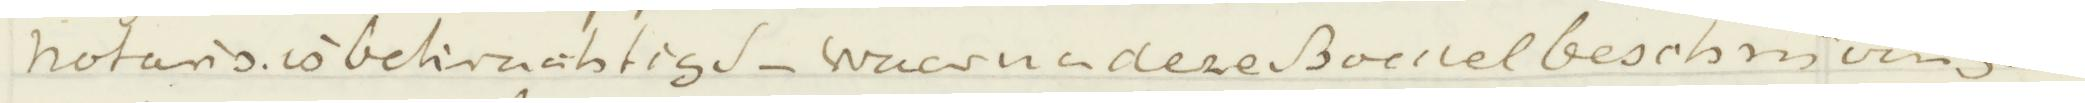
Notaris is bekrachtigd - waarna deze Boedel beschrijving is
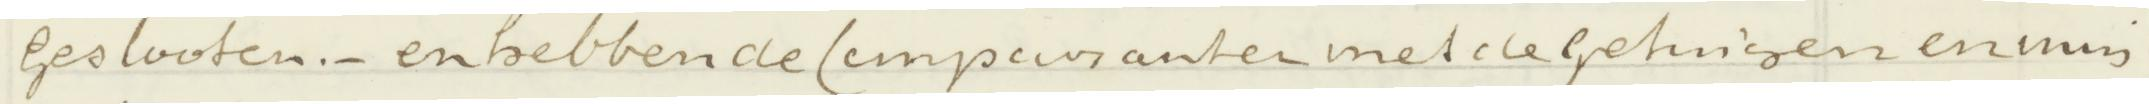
geslooten. - en hebben de Comparanten met de getuigen en my
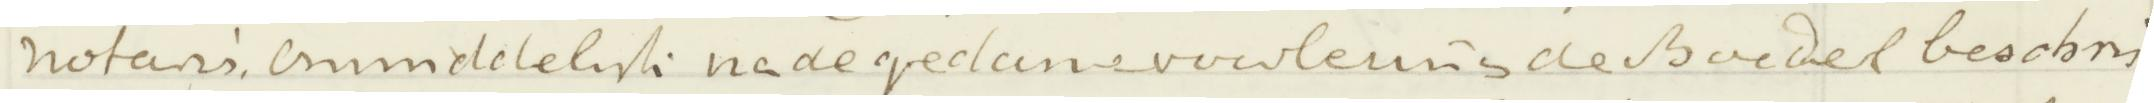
notaris, onmiddelyk na de gedane voorlezing de Boedel beschry
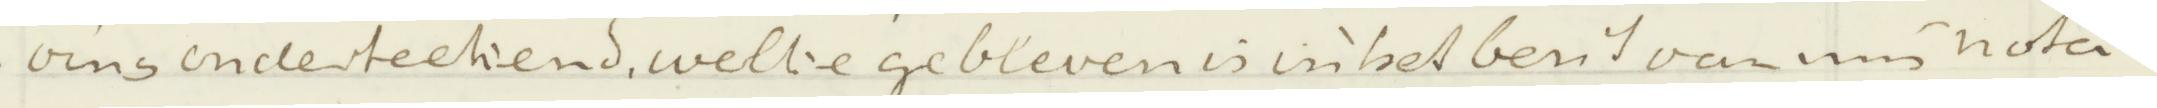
ving onderteekend, welke gebleven is in het bezit van mij nota-
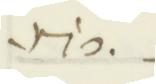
ris.
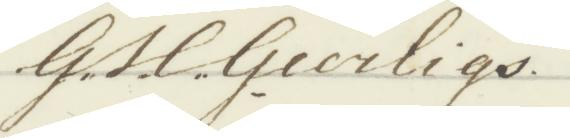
G.H.Geerligs.
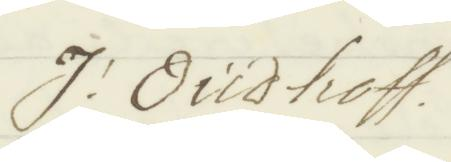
J: Oudhoff.
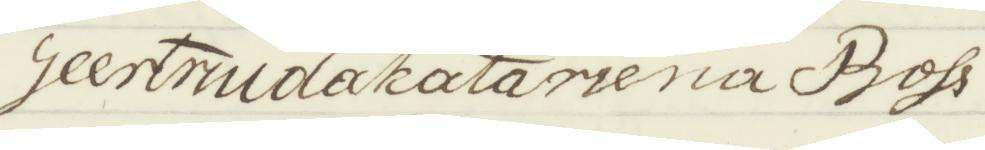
Geertruidakatariena Boss
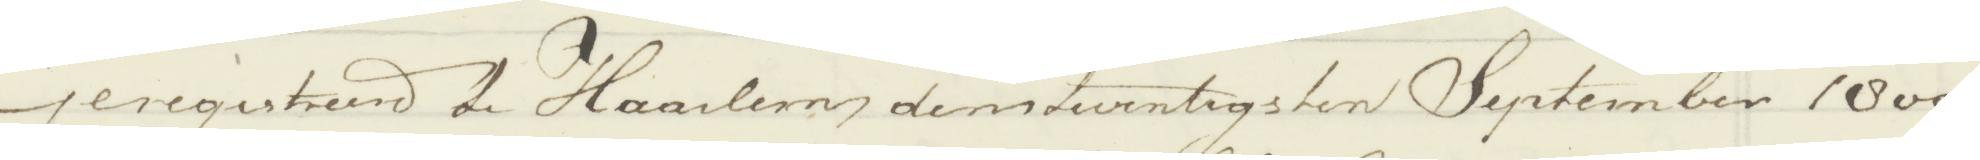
Geregistreerd te Haarlem, den twintigsten September 1800
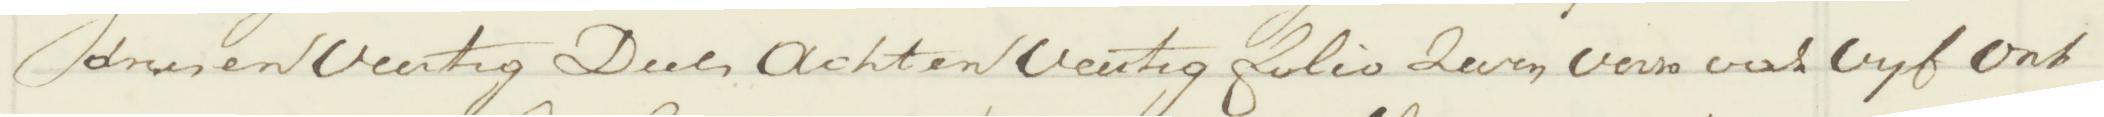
drie en Veertig Deel Acht en Veertig folio Zeven verso vak vyf ont
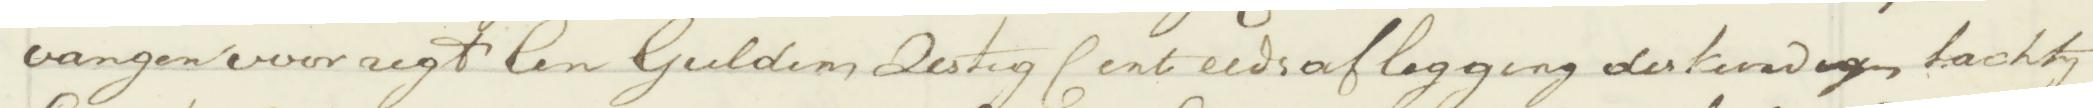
vangen voor regt Een Gulden Zestig Cent eedsaflegging deskundige tachtig
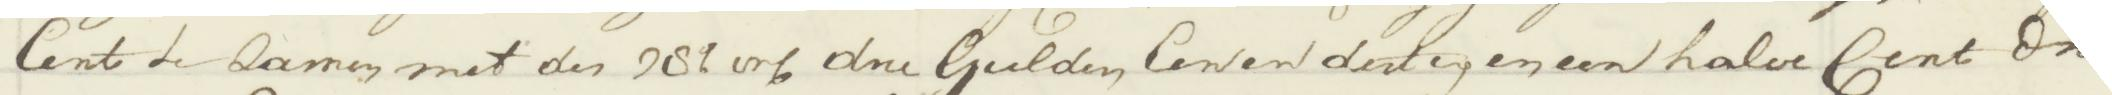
Cent te zamen met de 38% opc drie Gulden Een en dertig en een halve Cent drieen
